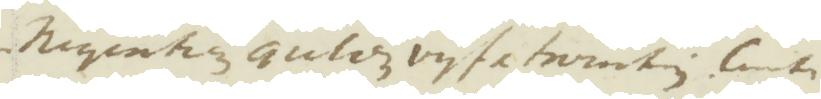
negentien gulden vyf en twintig Cents
